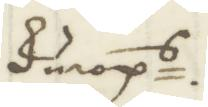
Europ=s.
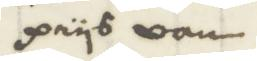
prijs van
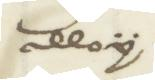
alloij
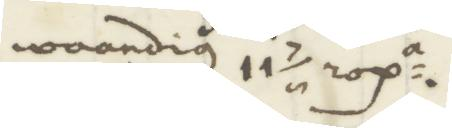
woordig 11 7/11 rop=a
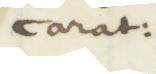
carat:
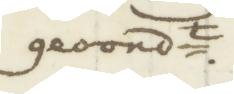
geoord=t
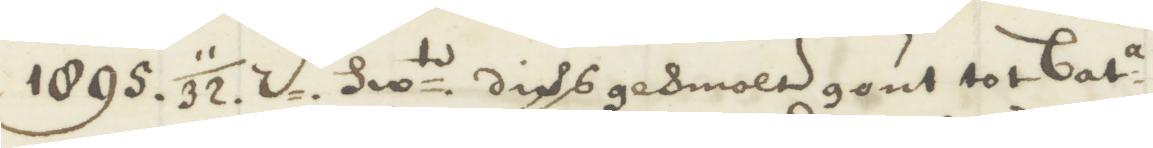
1895. 11/32. r=l sw=te divers gesmolte gout tot bat:a
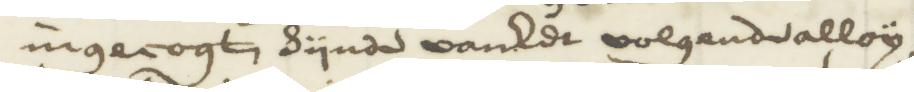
ingecogt, sijnde van het volgende alloij,
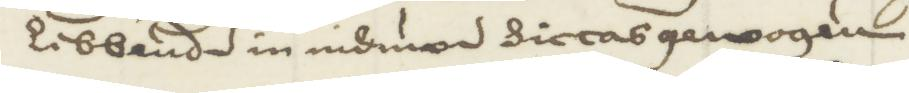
hebbende in nieuwe siccas gewogen
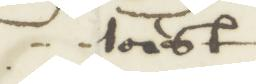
- -toest
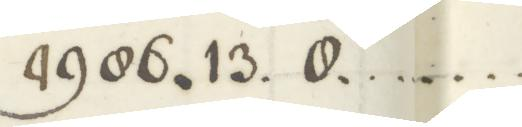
4986.13.8.
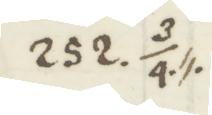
252.¾„
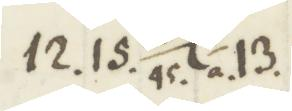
12.15. 297/45 o/a 13.
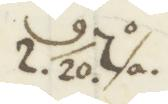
2. 9/20.ro/a
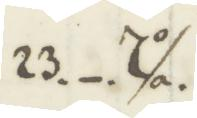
23.–.ro/a
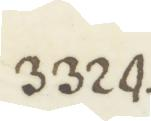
3324.
